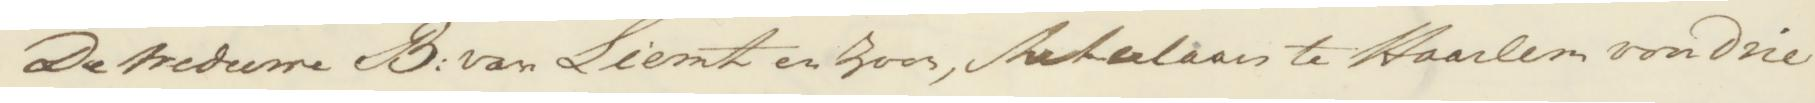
De weduwe B: van Liemt en zoon, Metselaars te Haarlem voor drie
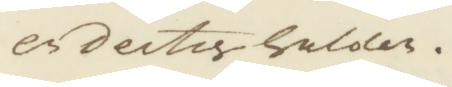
en dertig Gulden.
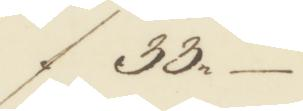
ƒ 33„ —
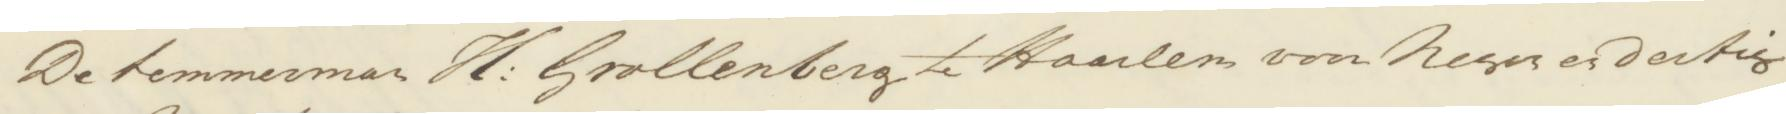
De timmerman H: Grollenberg, te Haarlem voor Negen en dertig
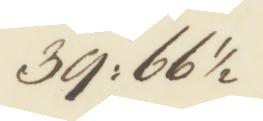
39: 66½
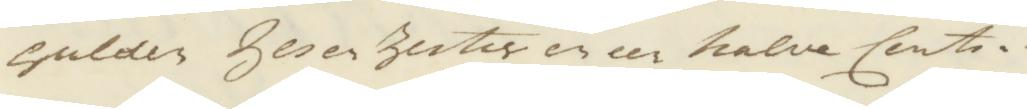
Gulden Zes en Zestig en een halve Cents.
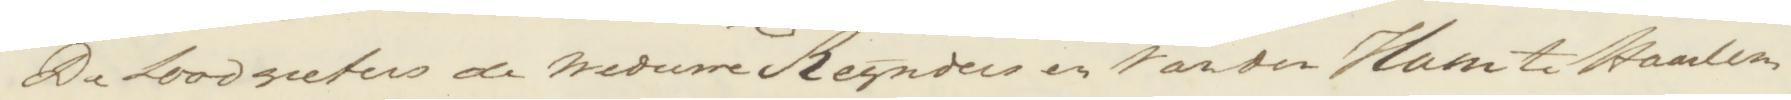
De Loodgieters de weduwe Reijnders en van der Ham te Haarlem
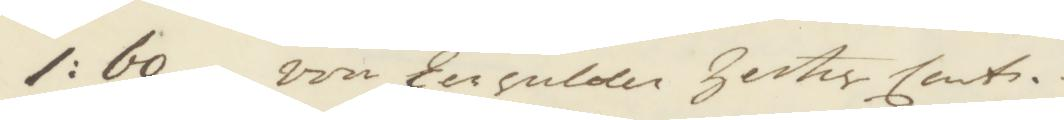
1: 60 voor Een gulden Zestig Cents.
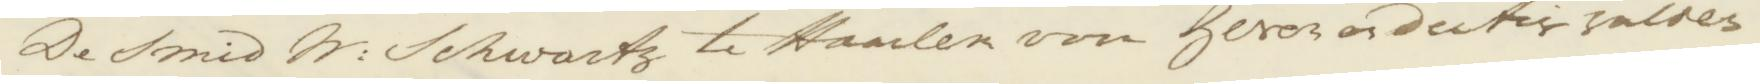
De Smid W: Schwartz te Haarlem voor Zeven en dertig gulden
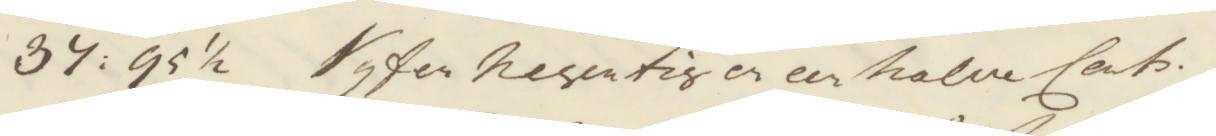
37: 95½ Vyfen negentig en een halve Cents.
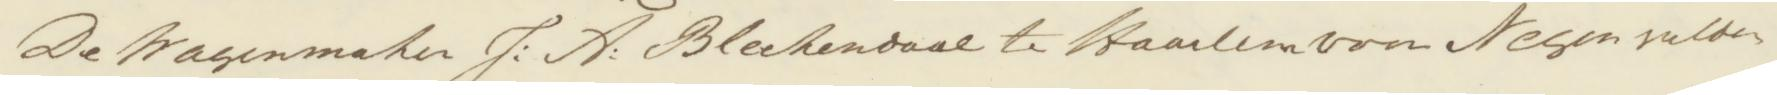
De Wagenmaker J: A: Bleekendaal te Haarlem voor Negen gulden
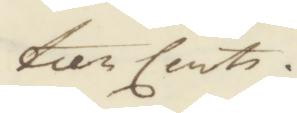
tien Cents.
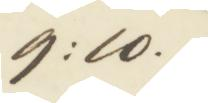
9: 10.
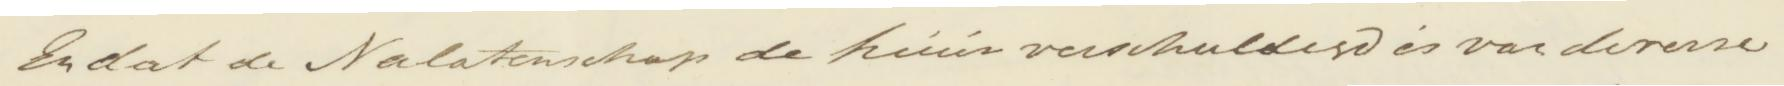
En dat de Nalatenschap de huur verschuldigd is van diverse
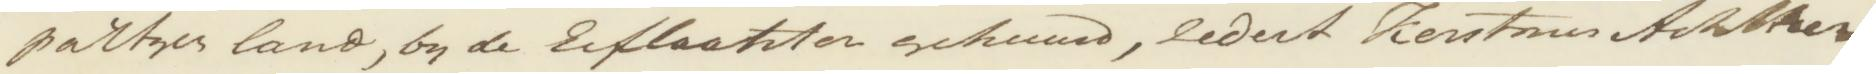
partyen land, by de Erflaatster gehuurd, zedert Kerstmis Achttien
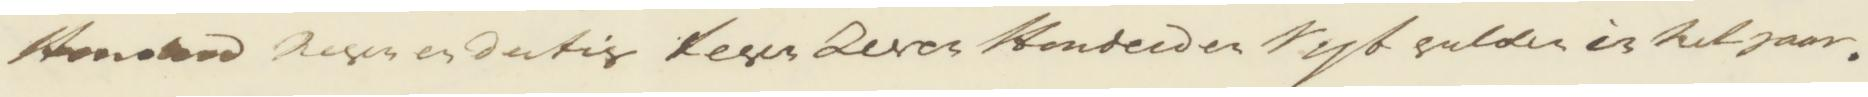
honderd negen en dertig tegen zeven Honderd en Vijf gulden in het jaar,
